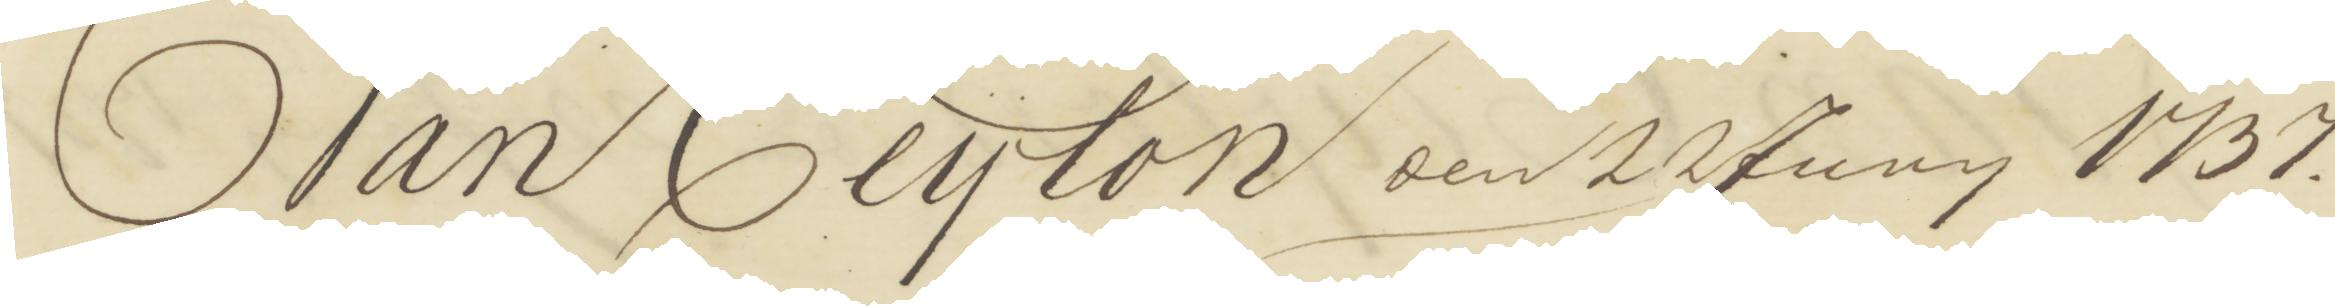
Van Ceijlon den 22 Juny 1737.
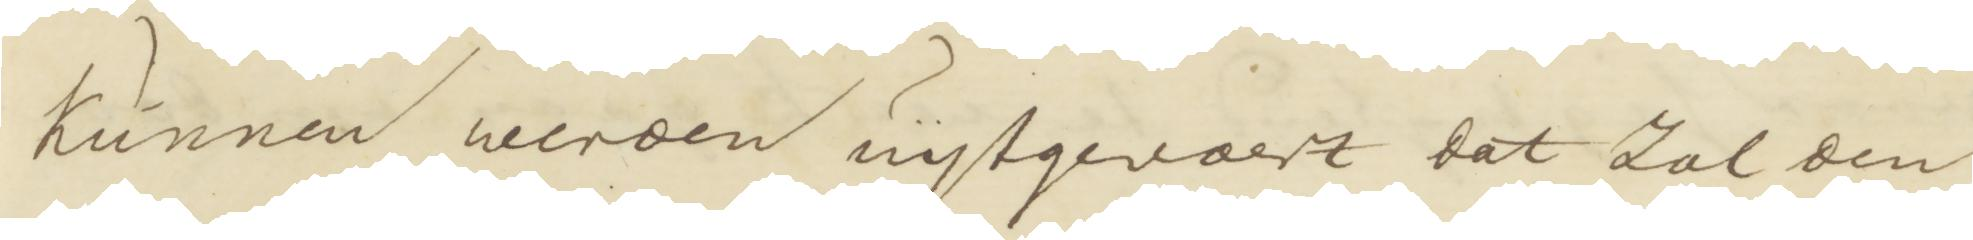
kunnen werden uijtgevoert dat zal den
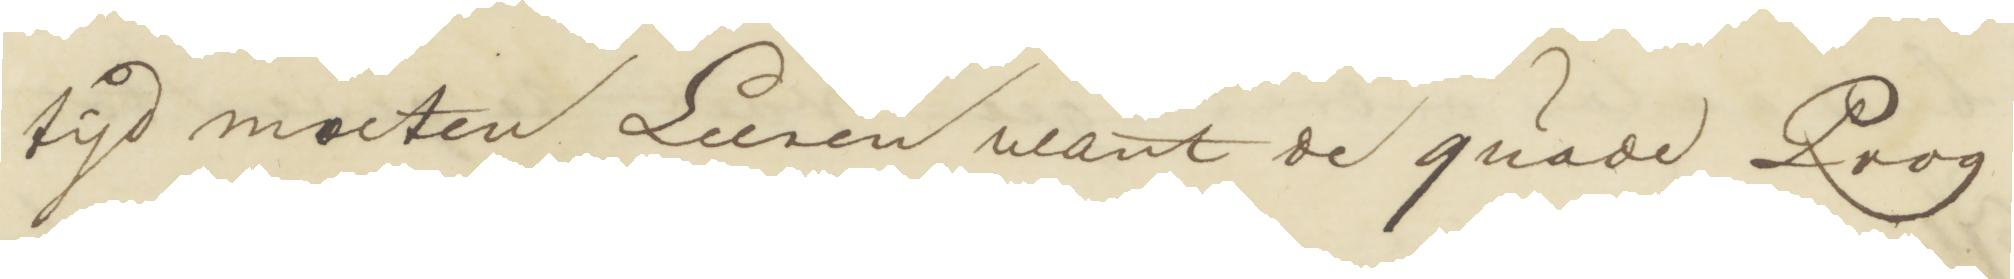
tijd moeten Leeren want de quade Prog
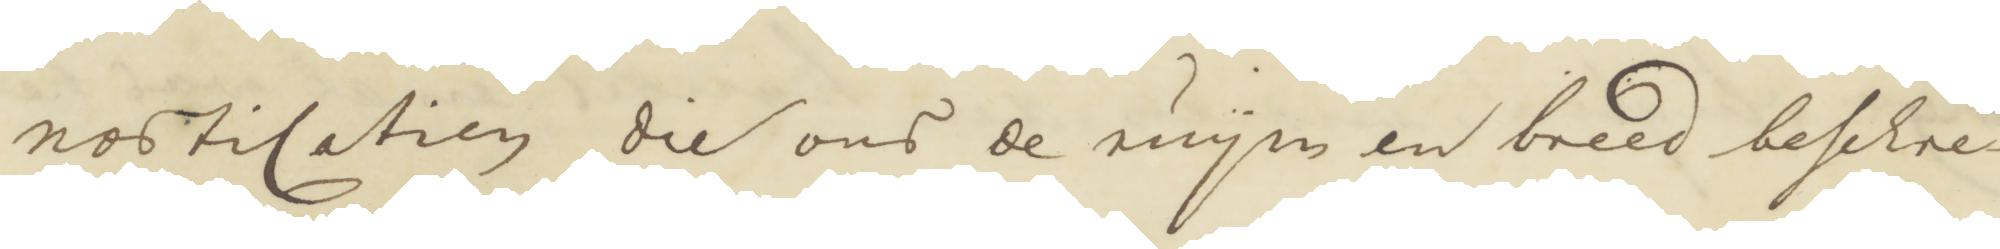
nosticatien die ons de ruijm en breed beschre
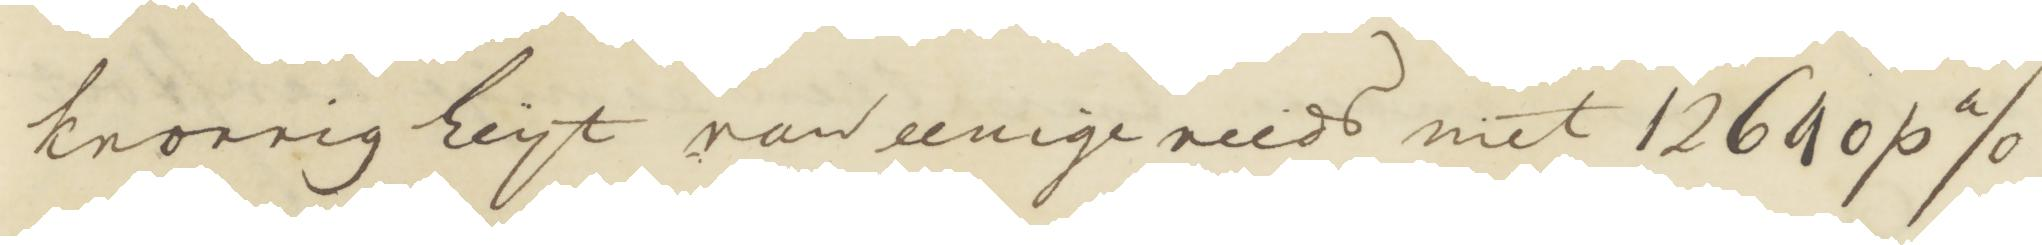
krorrig heijt van eenige reeds met 12640 pa/o
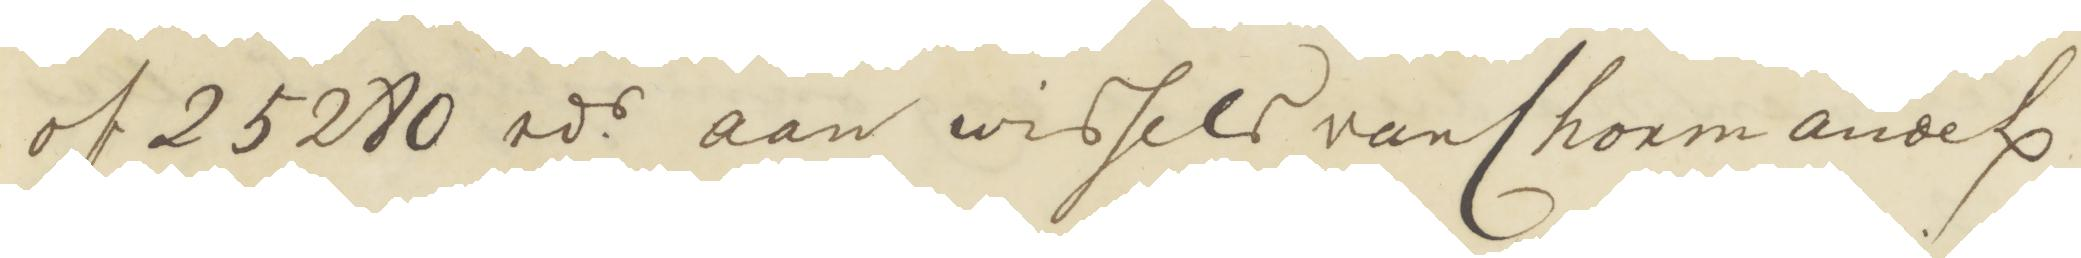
of 25280 rd.s aan wissels van Chorm andel
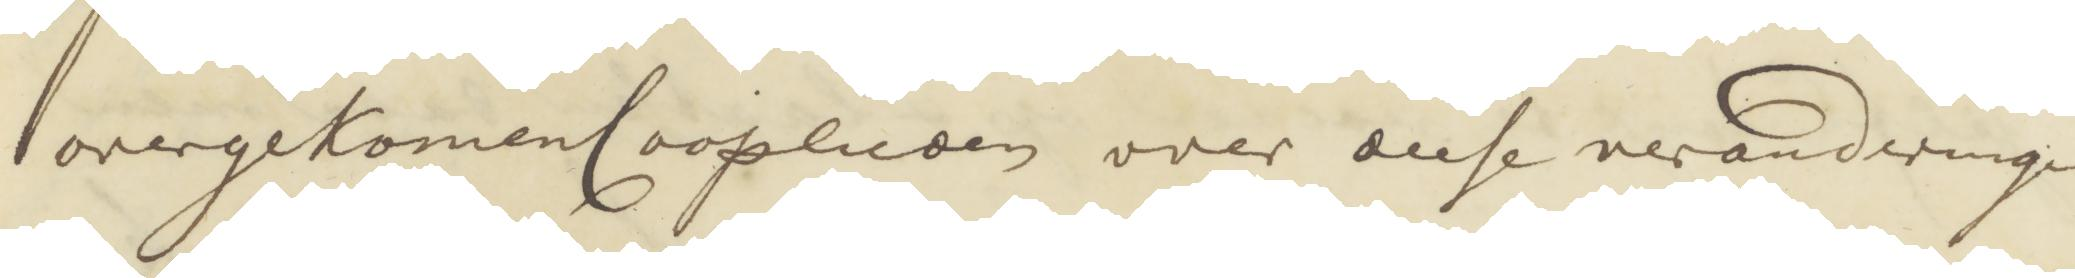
overgekomen Cooplieden over deese veranderinge
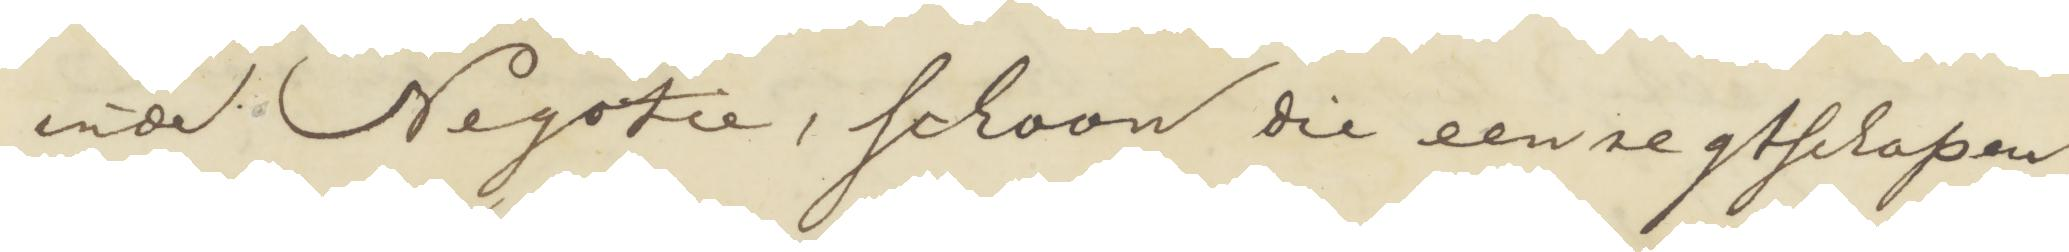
inde Negotie, schoon die een regtschapen
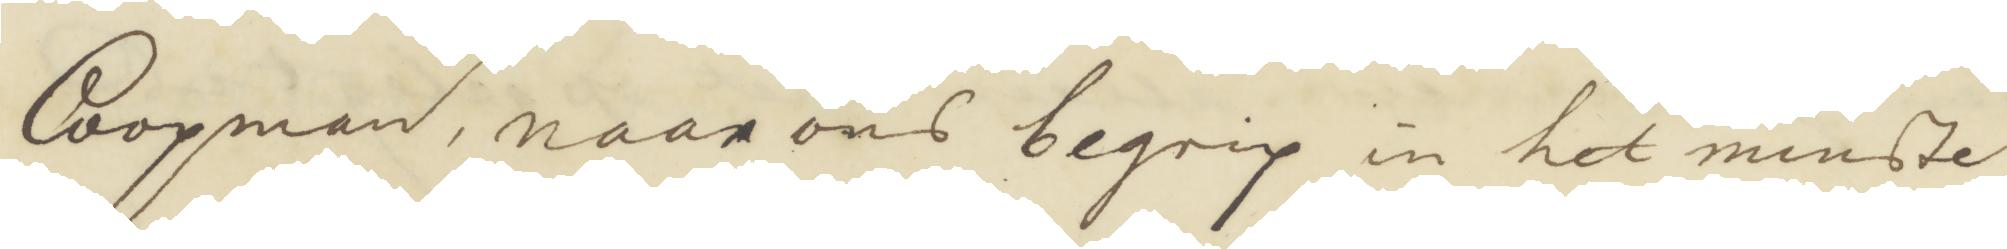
Coopman, naar ons begrip in het minste
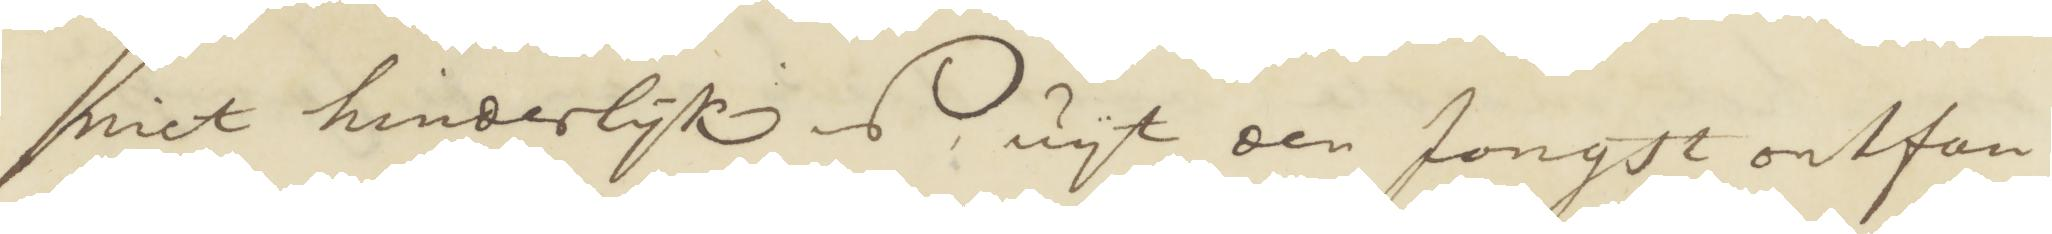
niet hinderlijk is uijt den Jongst ontfan
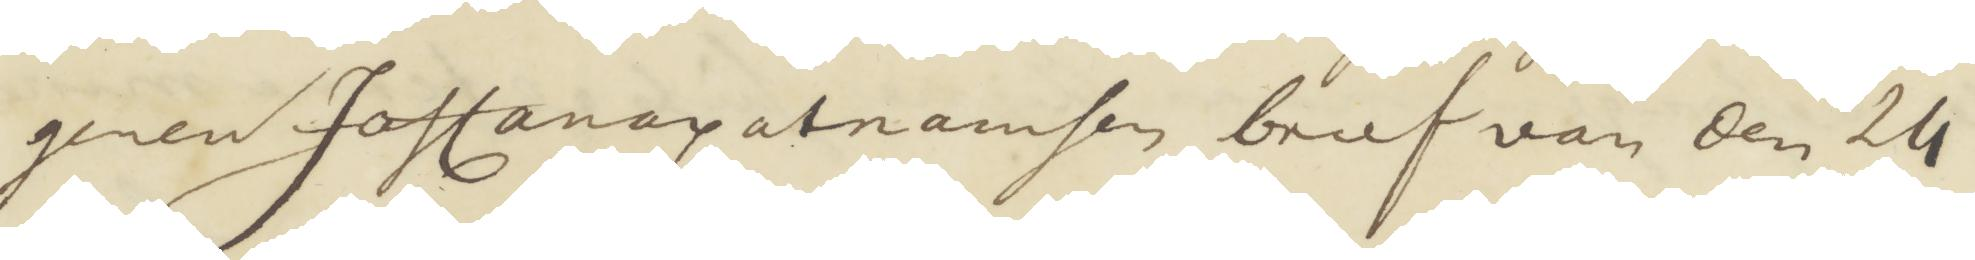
genen Jascanapatnamsen brief van den 24
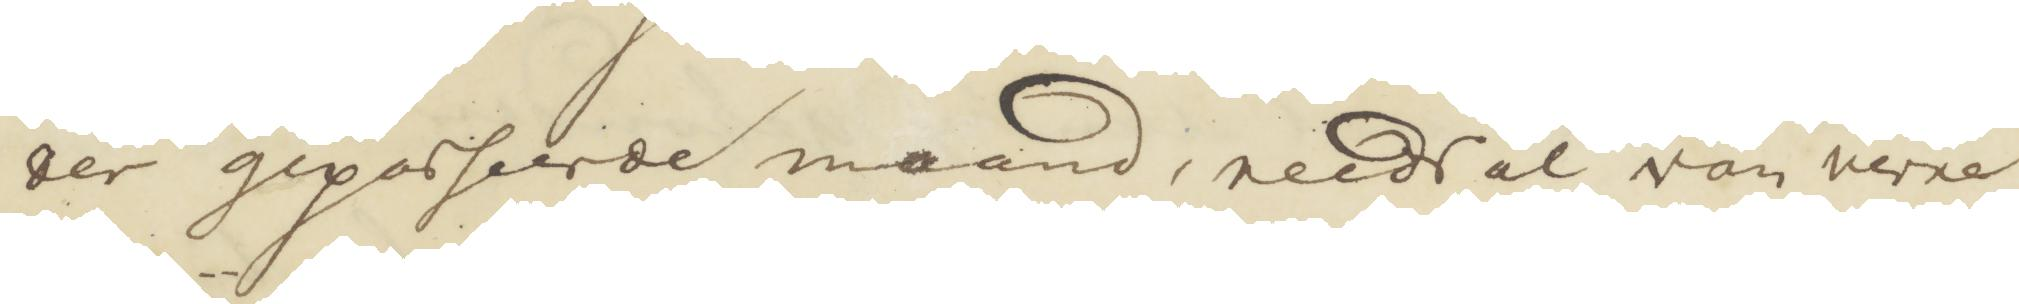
der gepasseerde maand, reeds al van verre
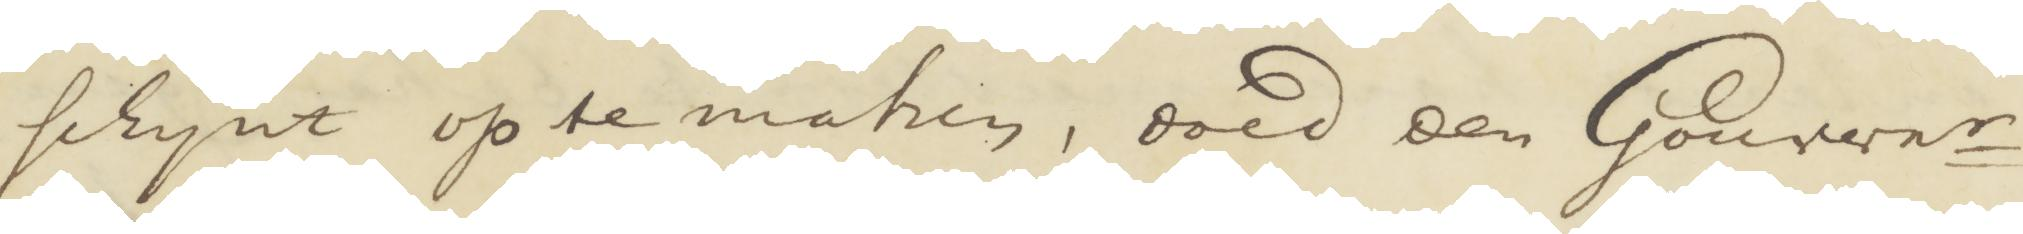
schijnt op te maken, doed den Gouvern=r
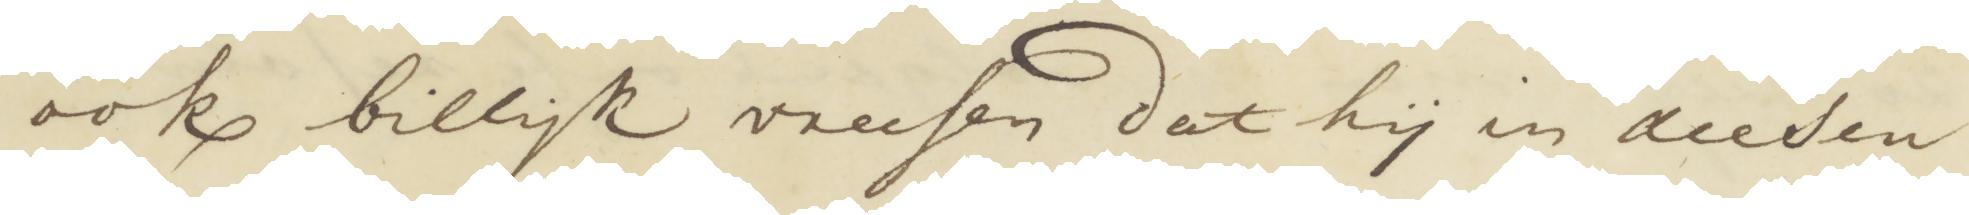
ook billijk vreesen dat hij in deesen
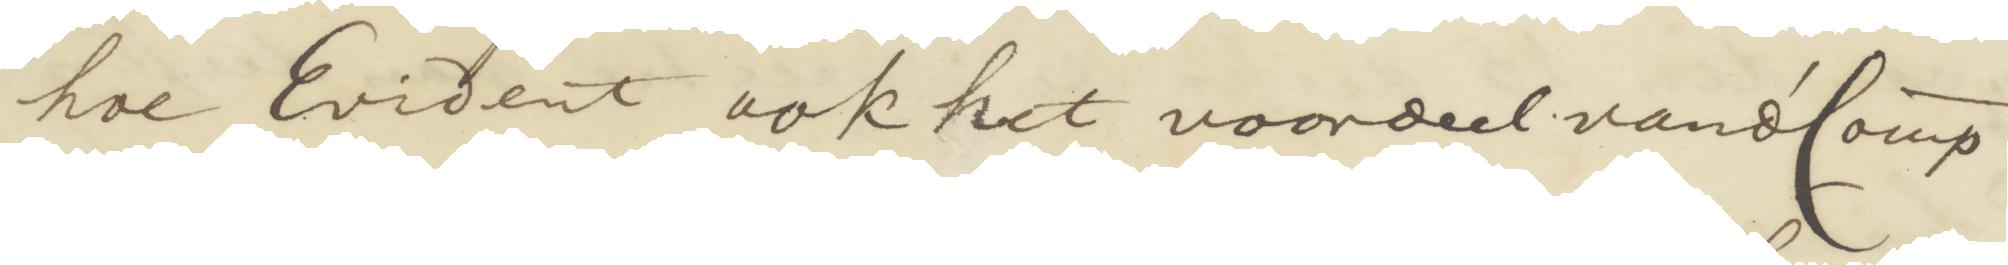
hoe Evident ook het voordeel van d' Comp
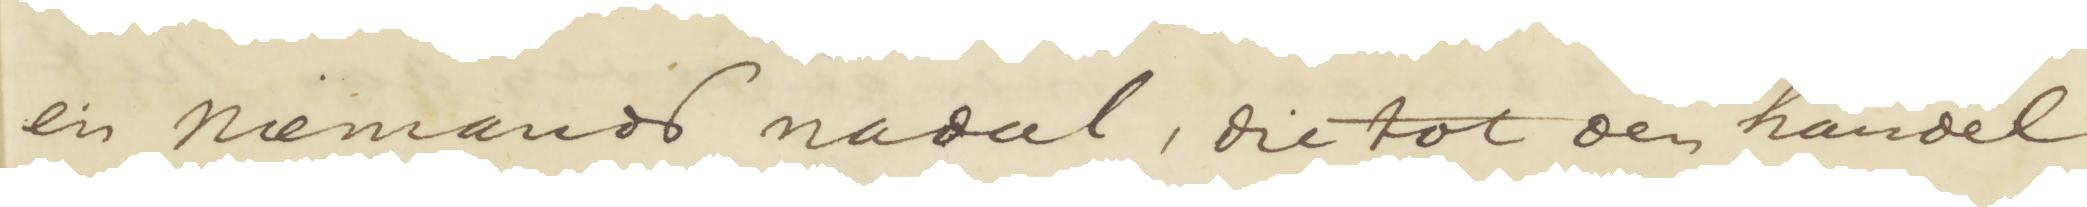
en niemands nadeel, die tot den handel
